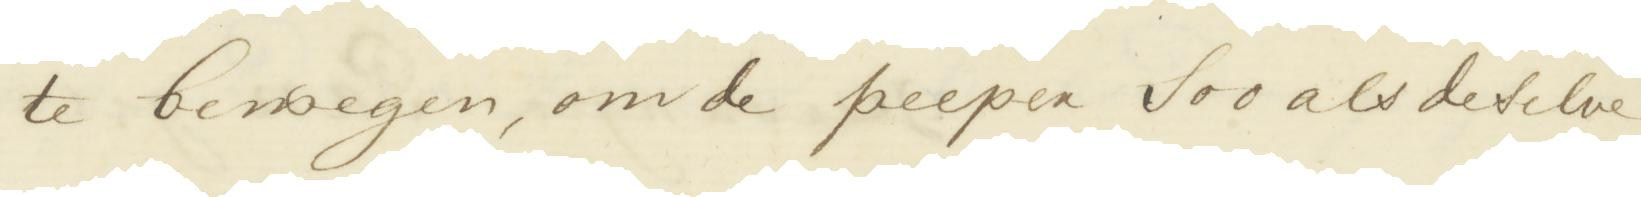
te bewegen, om de peeper soo als deselve
